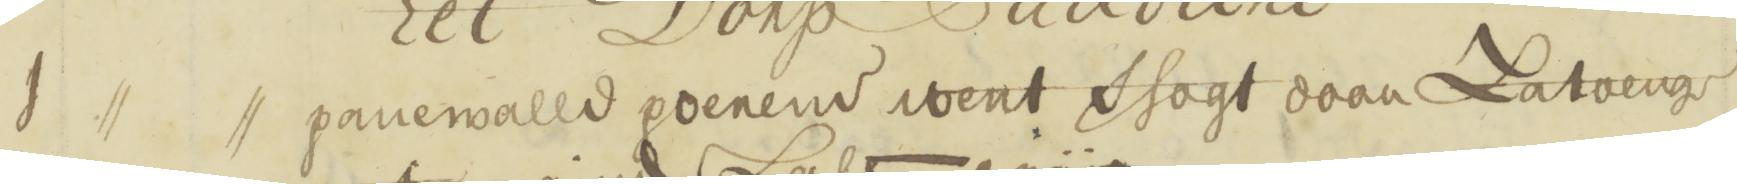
1 „ „ panewalle poerene wert versogt door Zatoenge
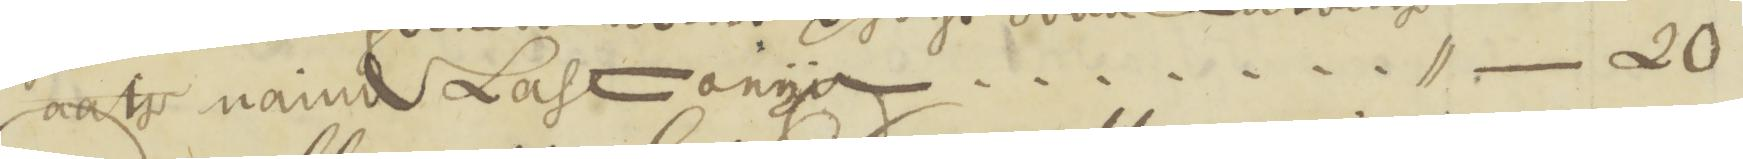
aatje nainde Lascorije . . . . . . . „ — 20
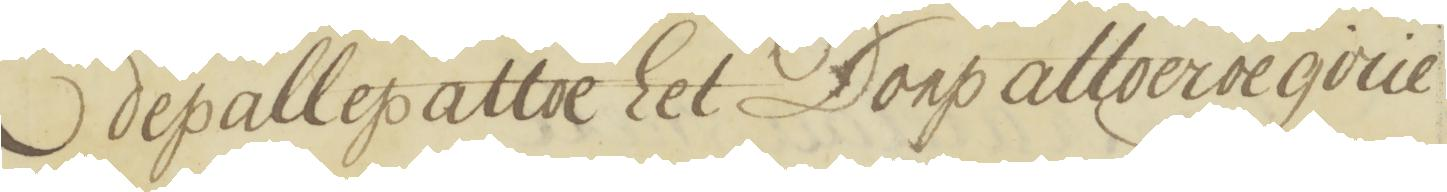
de pallepattoe het Dorp attoeroegorie
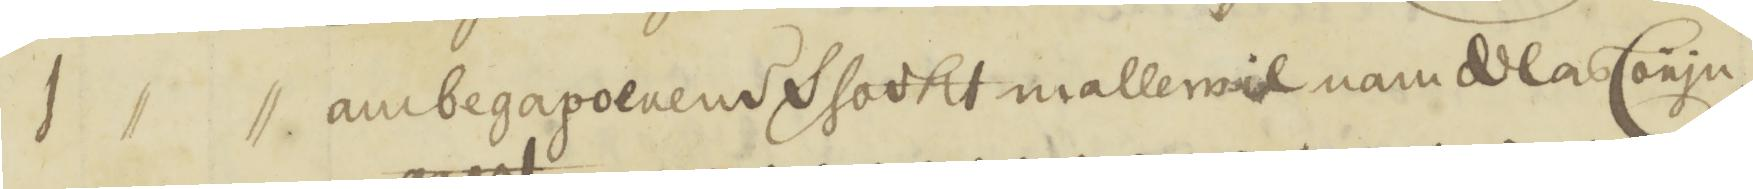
1.„ „ ambegapoerene versoekt mallewil nam de lascorijn
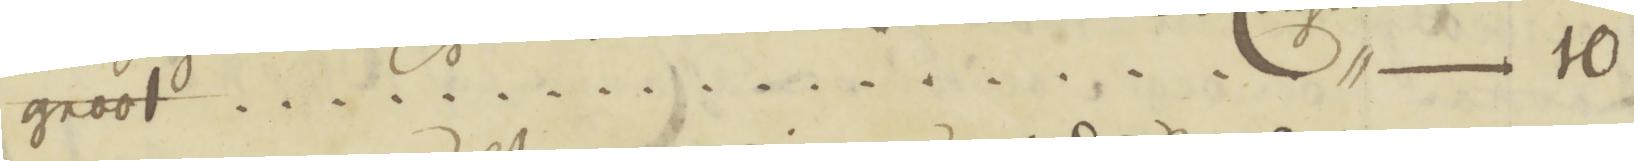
groot . . . . . . . . . . . . . . . . . . „ —10
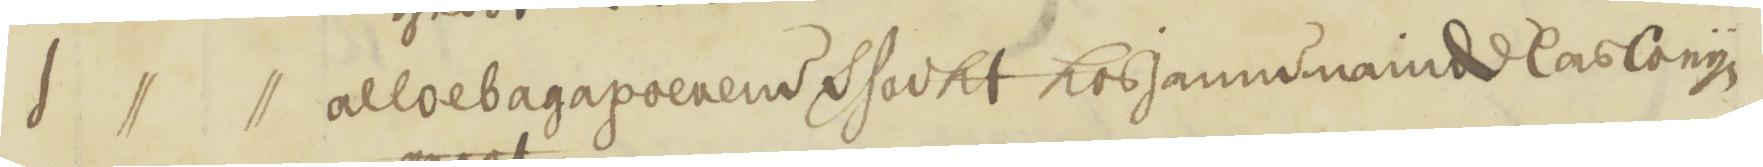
1.„ „ alloebagapoerene versoekt hosjanne nainde Cascorijn
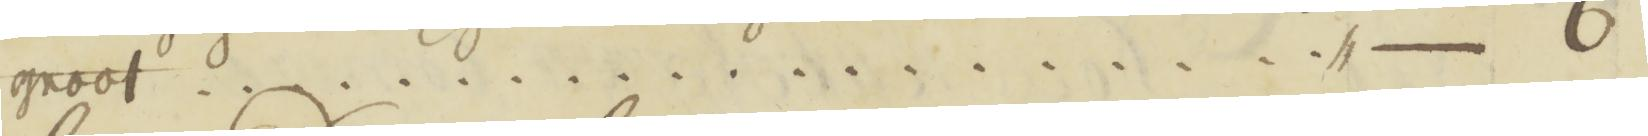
groot . . . . . . . . . . . . . . . . . . . . . „ — 6
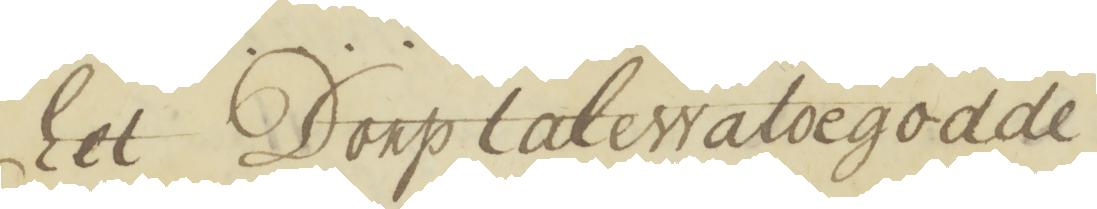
het Dorp talewatoegodde
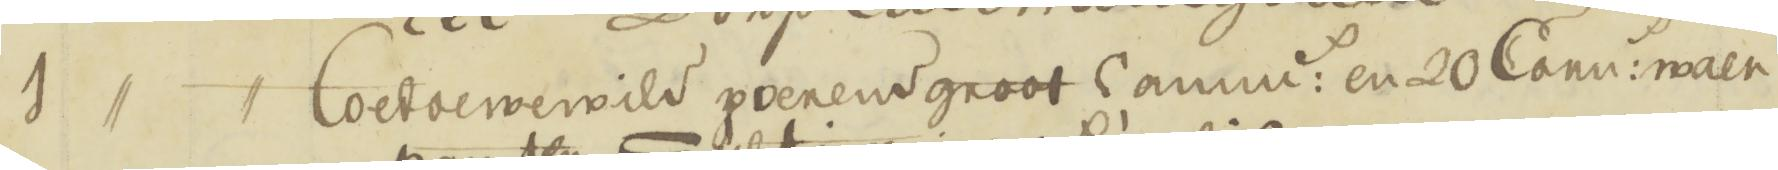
1:„ toedoewewile poerene groot 5 amm:s en 20 Corn:s waer
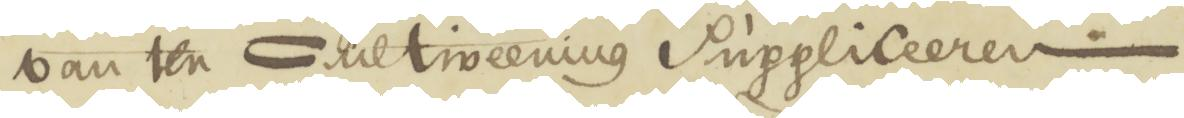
van ter Cultiveering Suppliceeren
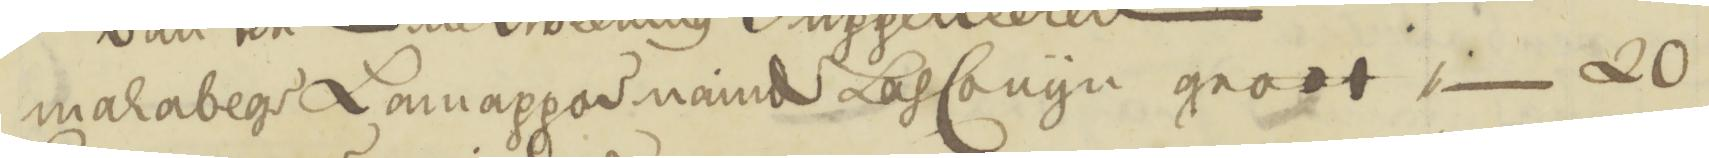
mahabege Lamappoe nainde Lascorijn groot „ —20
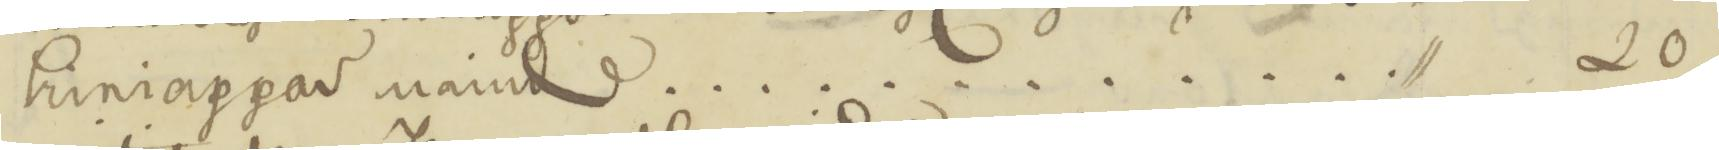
kiriappae nainde. . . . . . . . . . . . „ 20
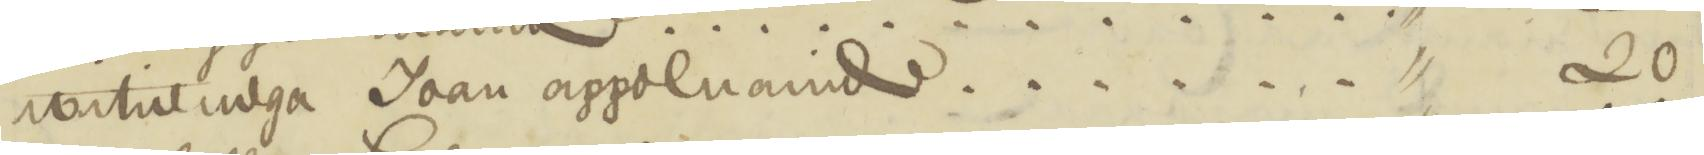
witie nega Ioan appolnainde . . . . . . „ 20
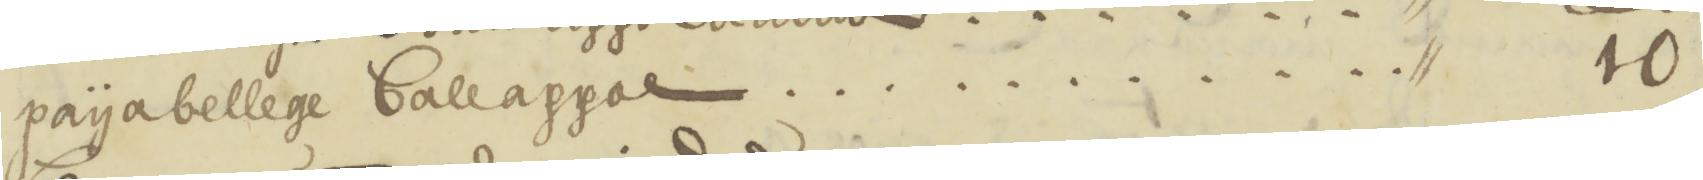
paijabellege baleappoe . . . . . . . . . . . „10
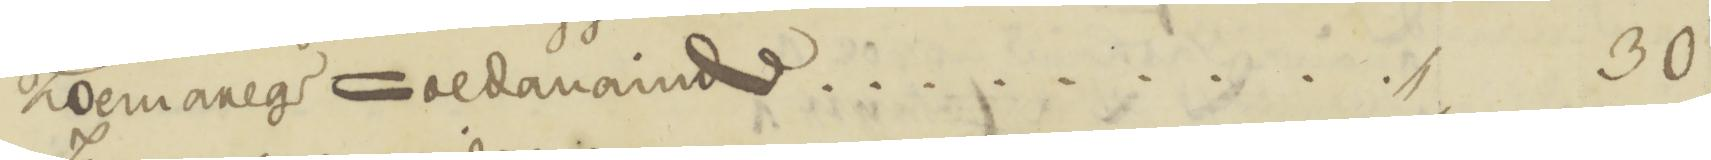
Loemarege Coedanainde. . . . . . . . . „ 30
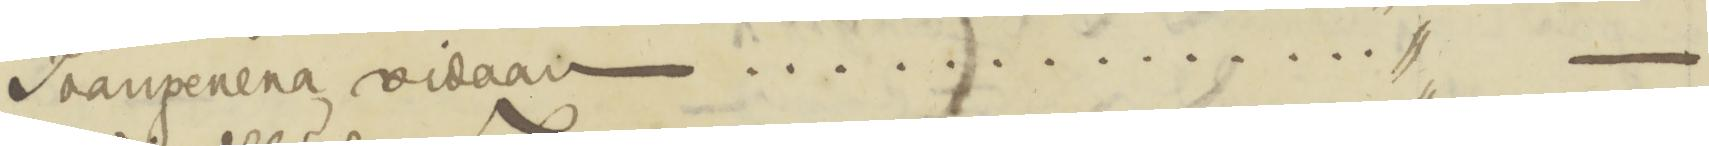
Ioanperera vidaan . . . . . . . . . . . . . . „ —
